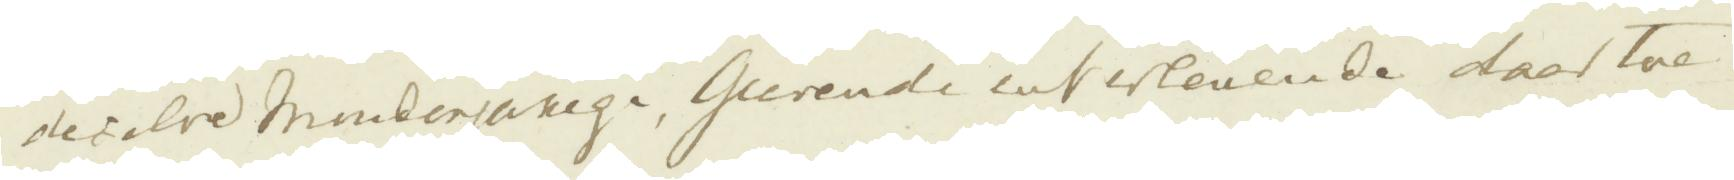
dezelve Minderjarige, Geevende en Vverlenende daar toe
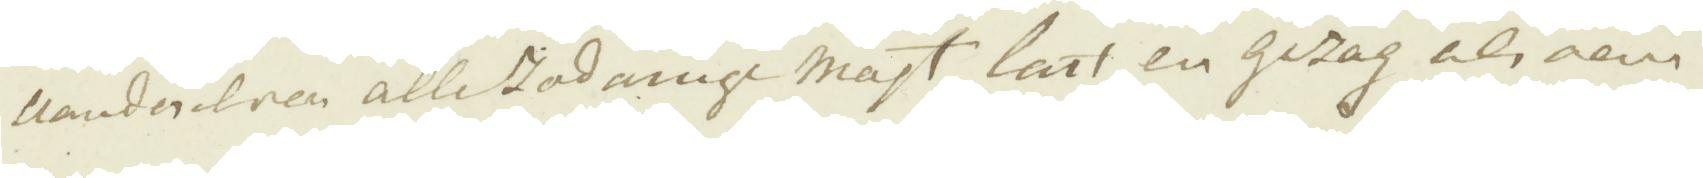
aandezelven alle zodanige magt, last, en gezag als aen
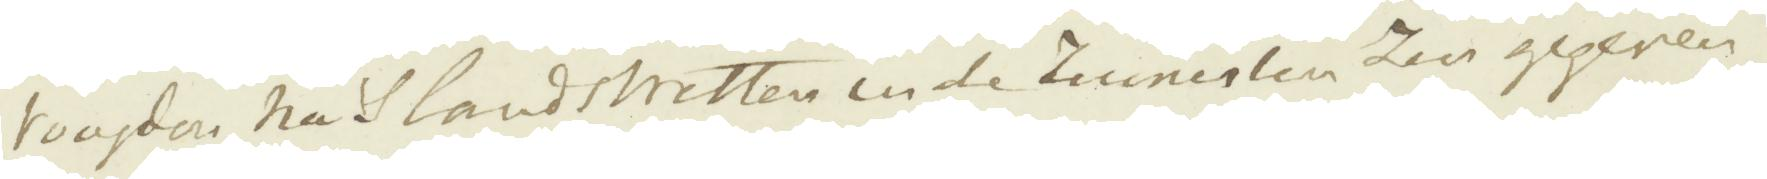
voogden na 's lands wetten in de ruimsten zin gegeven
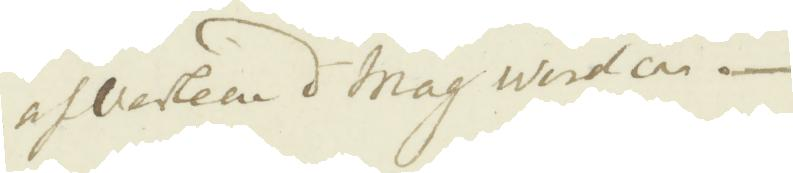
of verleend mag worden.
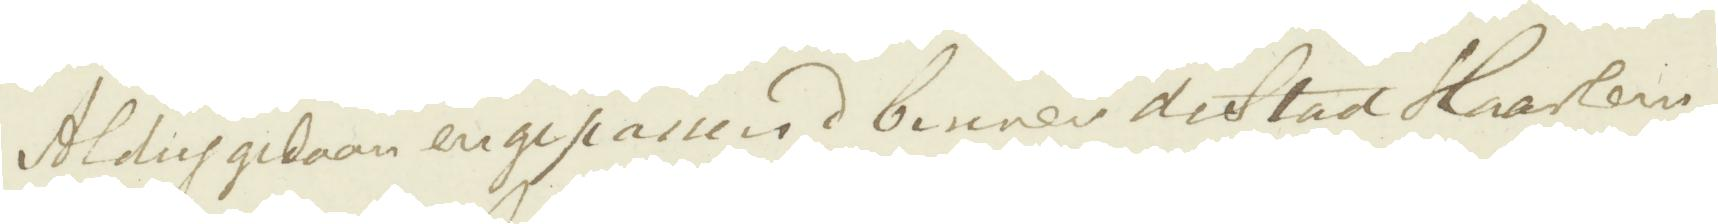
Aldus gedaan en gepasseerd binnen de stad Haarlem,
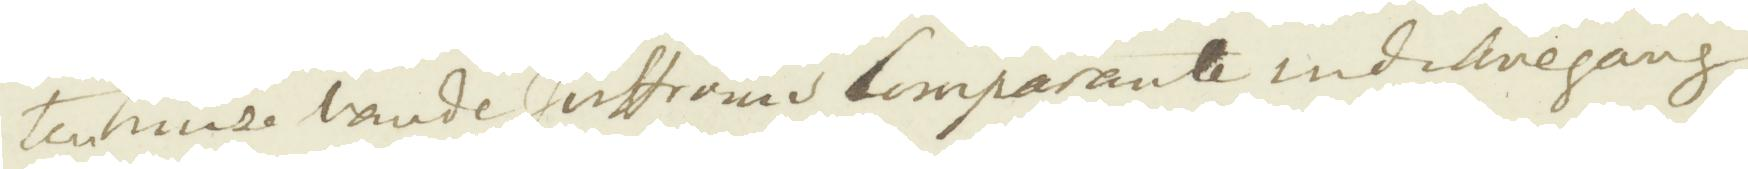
ten huize van de Juffrouw Comparante in de aregang
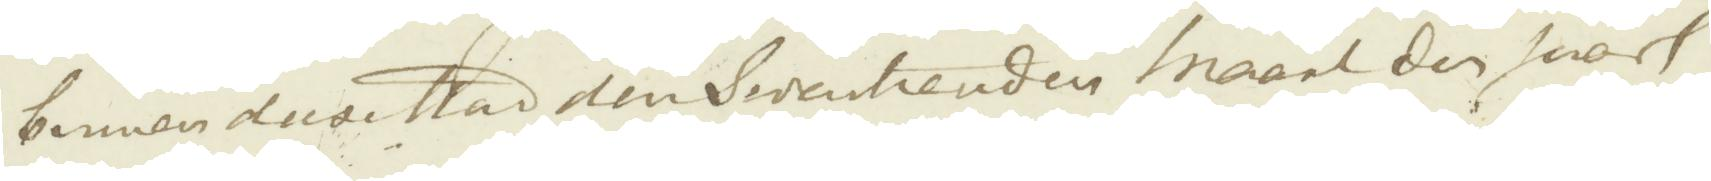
binnen deese stad, den Seventienden Maart den Jaars
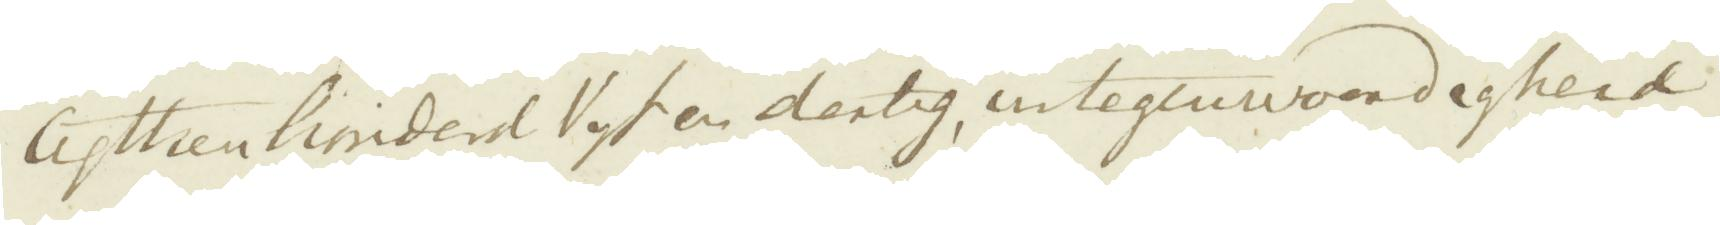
Agttien honderd vyf en dertig, integenwoordigheid
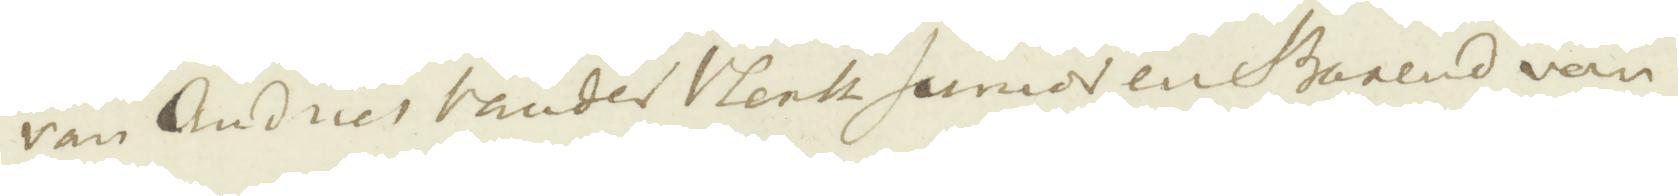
van Andries vander Vlerk Junior en Barend van
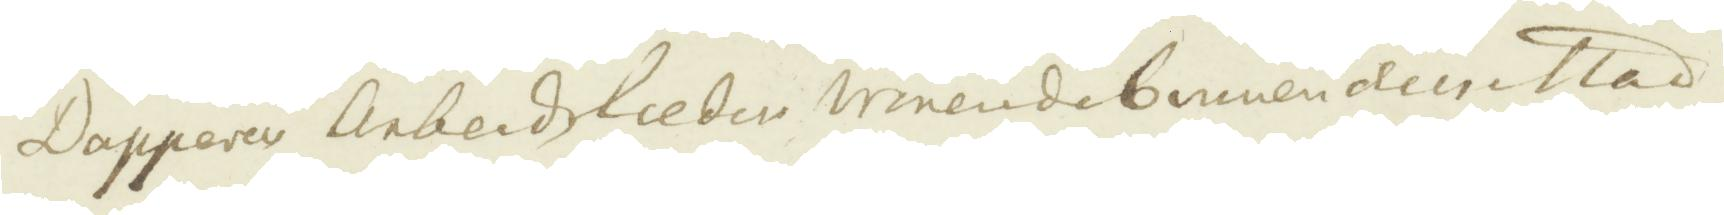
Dapperen Arbeidslieden wonende binnen deese stad
